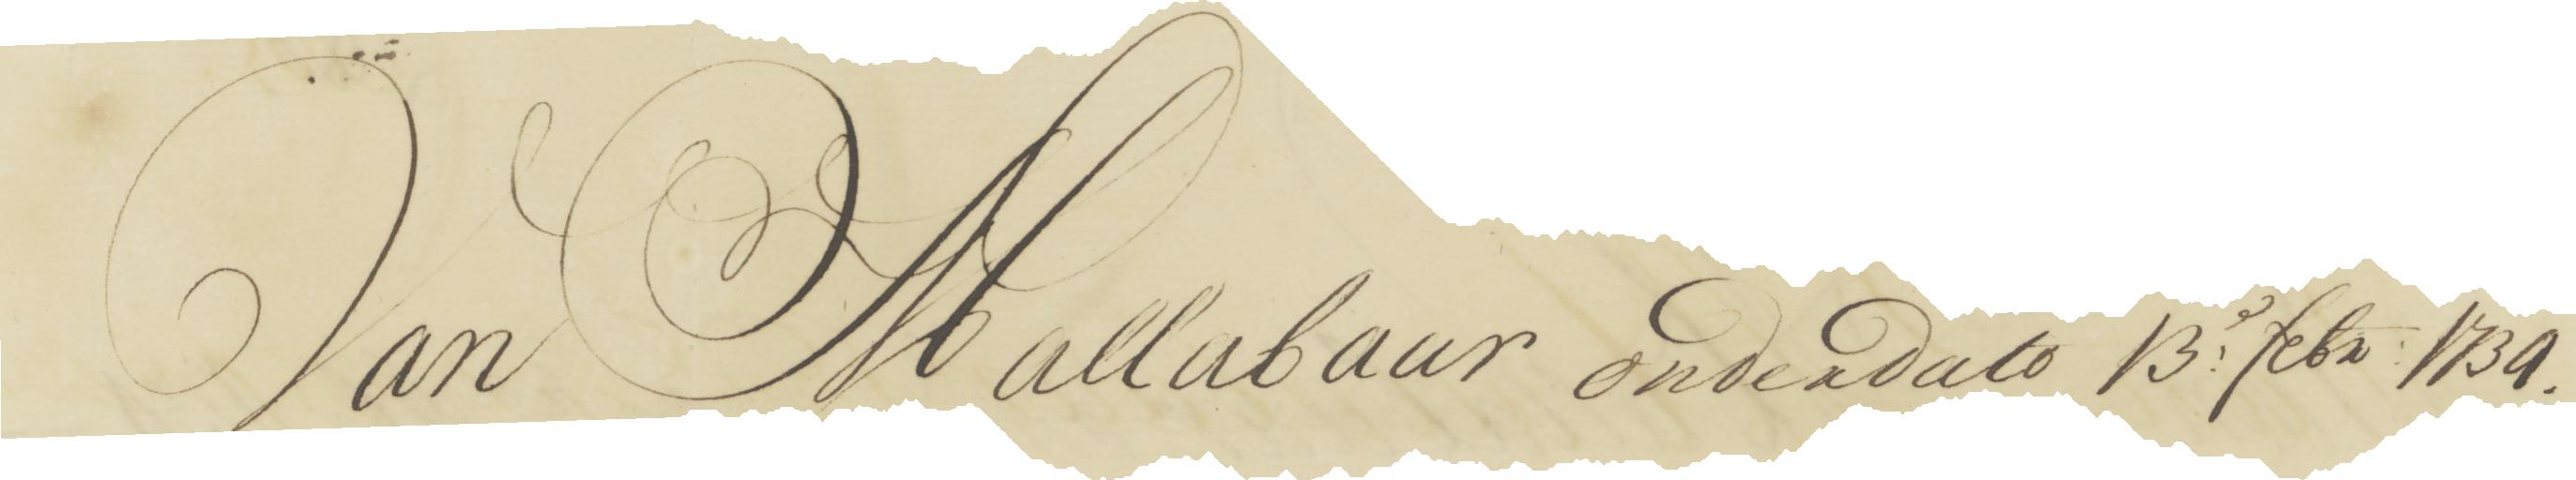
Van Mallabaar onder dato 13:e febr: 1734.
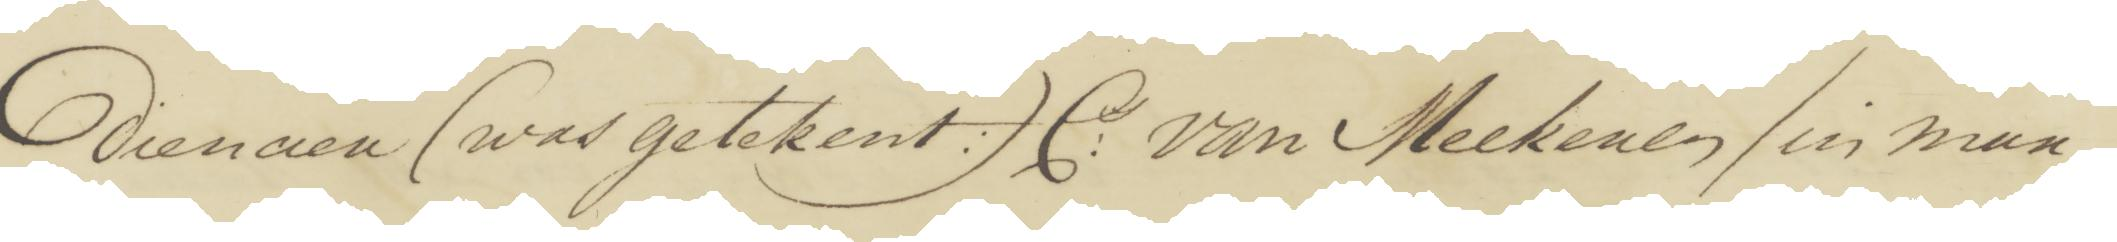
dienaer ( was getekent :) C:s van Meekeren / in mar
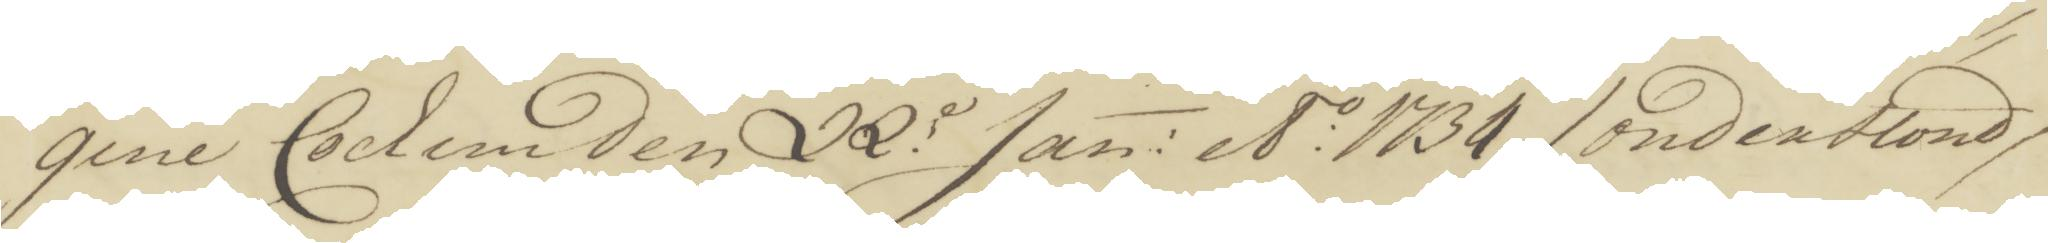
gine Cochim den 22:e Jan: A:o 1734. / onderstond /
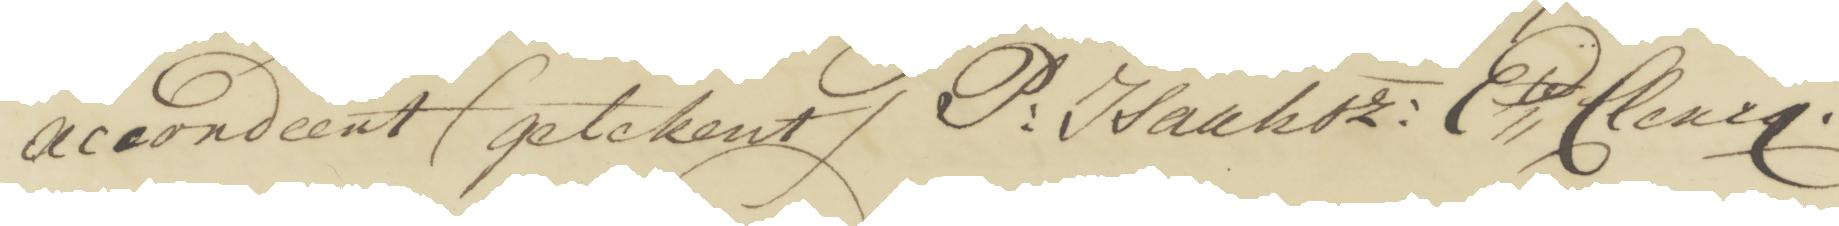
accordeert ( getekent ) P: Isaaksz: E„te Clercq.
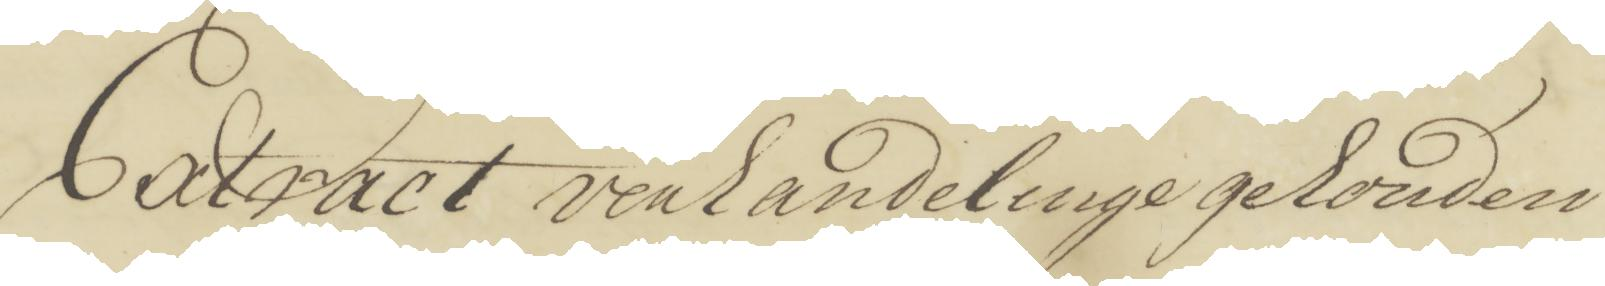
Extract verhandelinge gehouden
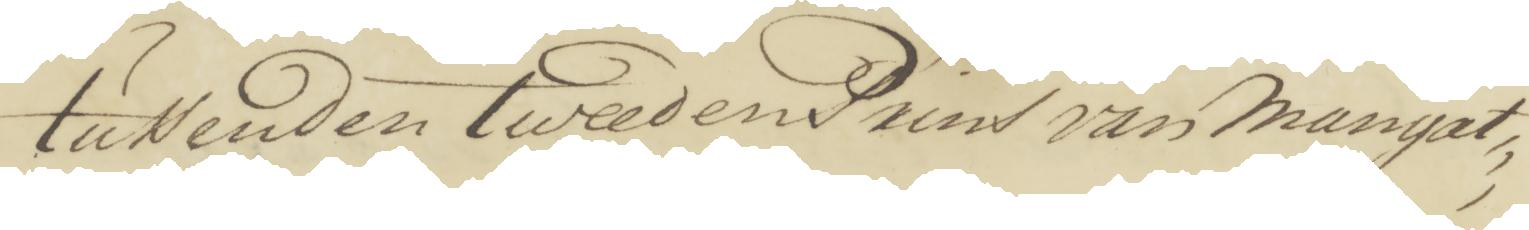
tussen den tweeden Prins van mangat„
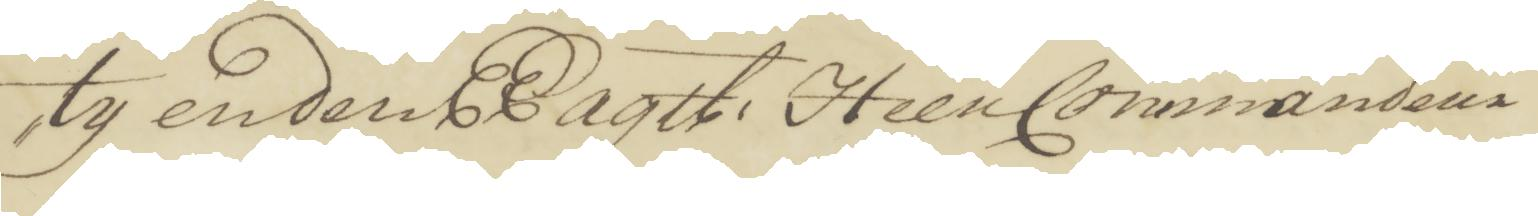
„ty en den EE agtb: Heer Commandeur
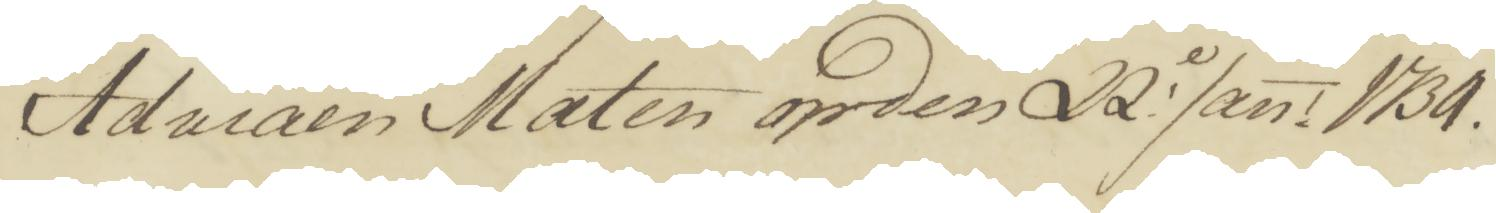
Adriaen Maten op den 22:e jan: 1734.
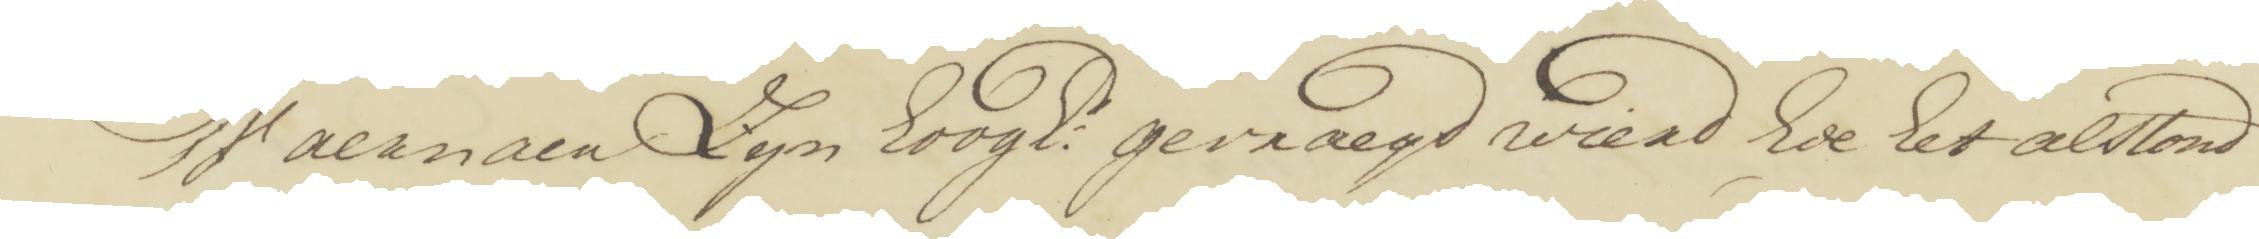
Waernaer zyn hoogh:d gevraegd wierd hoe het alstond
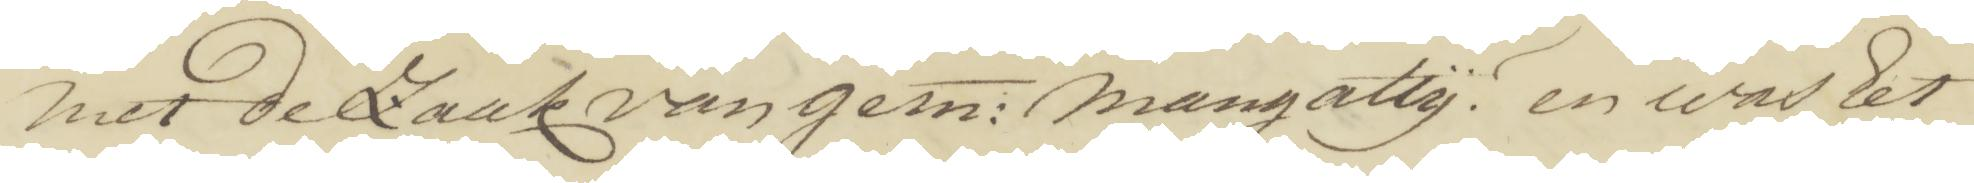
met de zaak van gem: mangattij? en was het
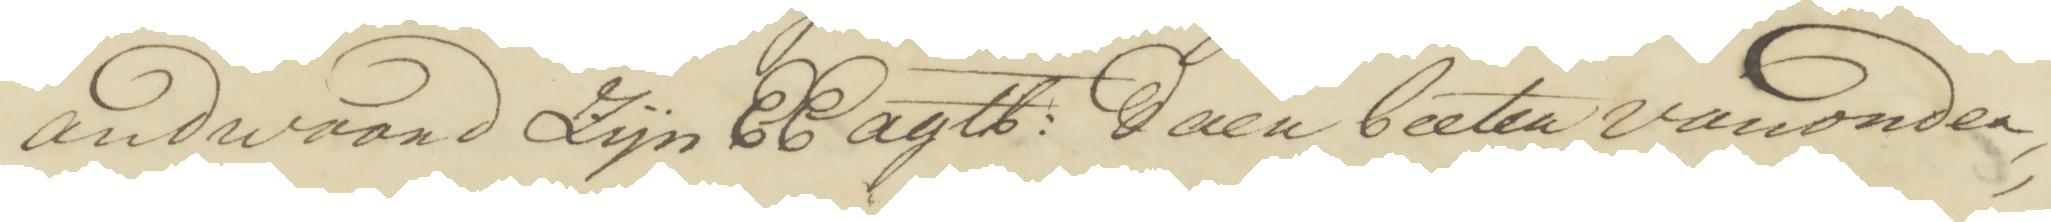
andwoord zijn EE agtb: daer beeter van onder„
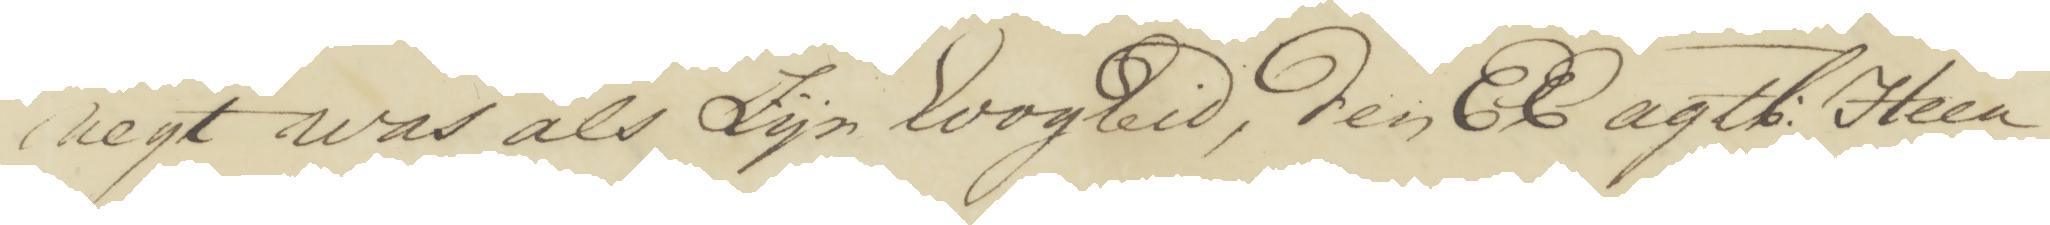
,regt was als zijn hoogheid, den EE agtb: Heer
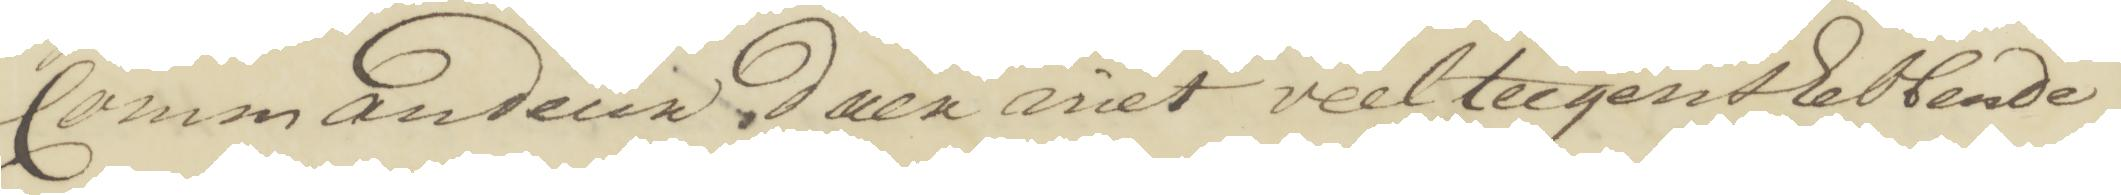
Commandeur daer niet veel teegens hebbende
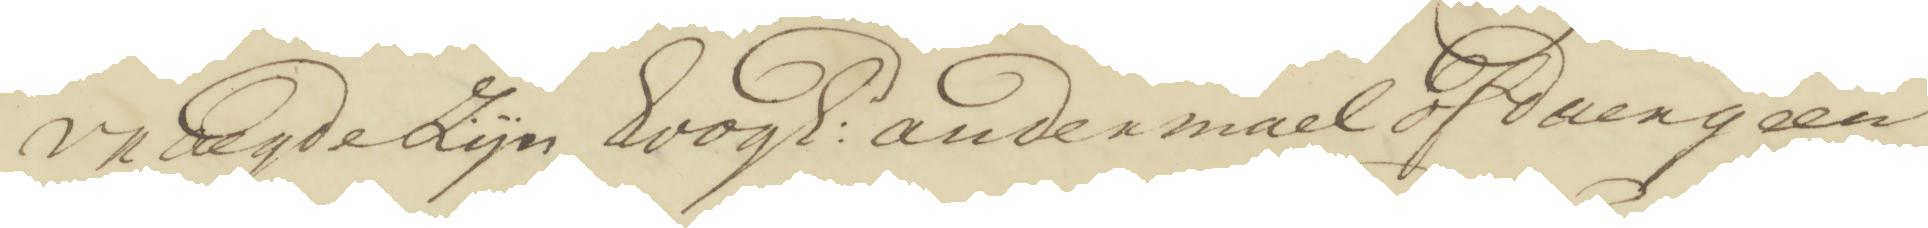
vraegde zijn hoogh:d andermael of daer geen
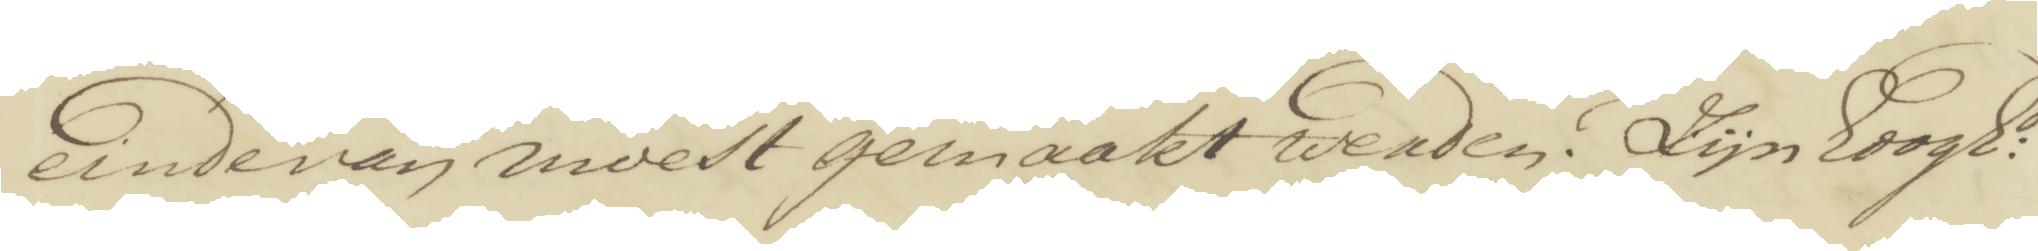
einde van moest gemaakt werden? zijn hoogh:d
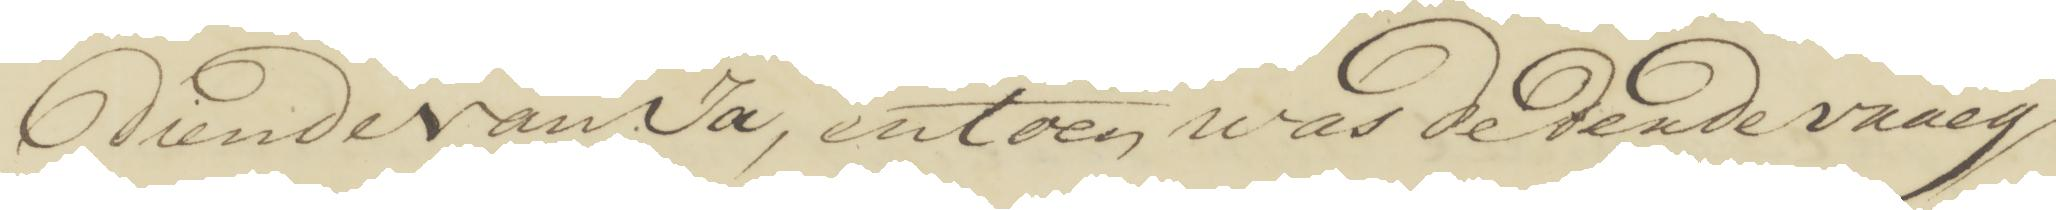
diende van Ia, en toen was de derde vraeg
